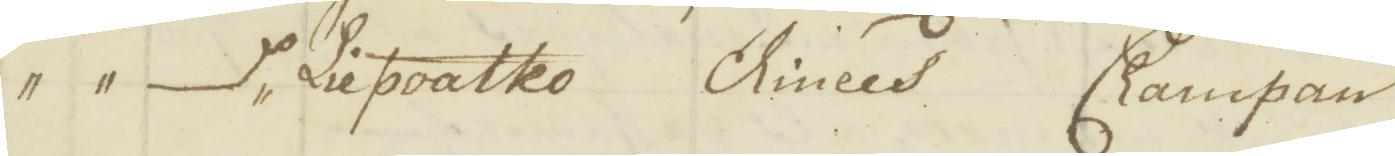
„ „ _„o Liepoatko Chinees Champan
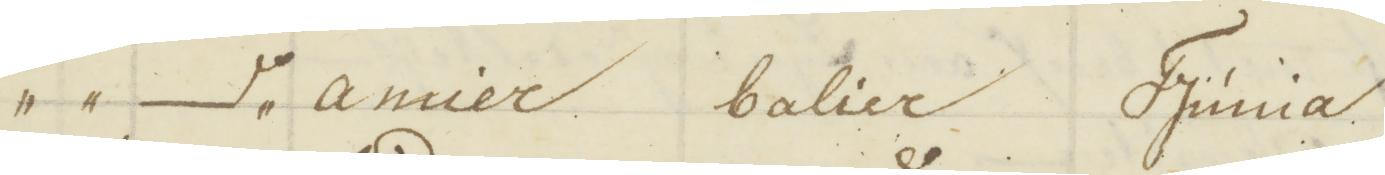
„ „ _„o amier balier Tjunia
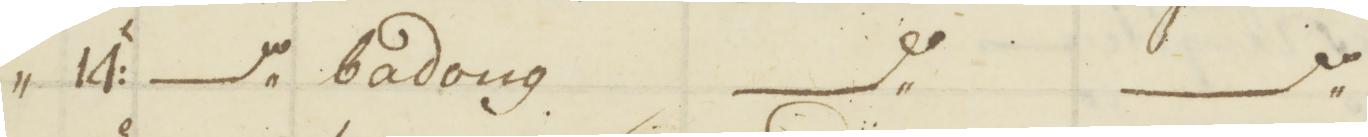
„ 14:en _„o badong _„o _„o
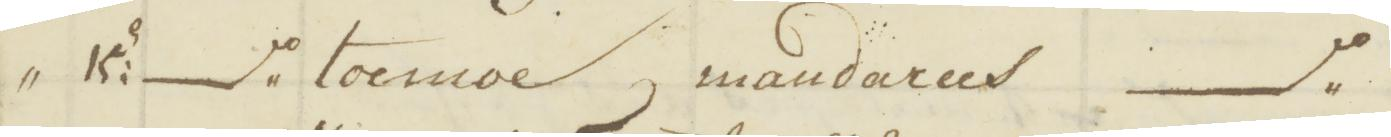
„ 15:en _„o toemoe mandarees _„o
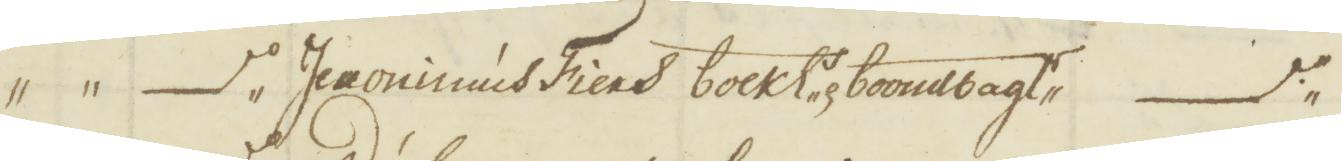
„ „ _„o Jeronimus Fiers boekh„s en boomwagt„r _„o
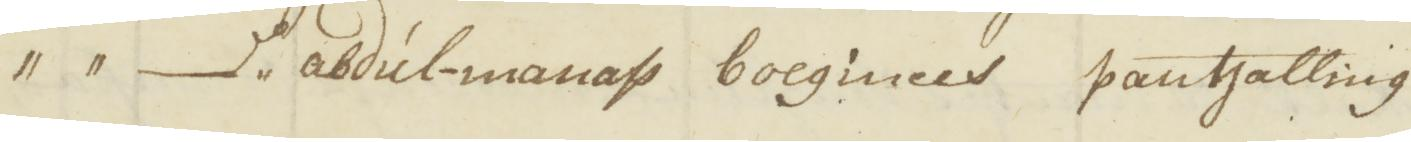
„ „ _„o abdul-manap boeginees pantjalling
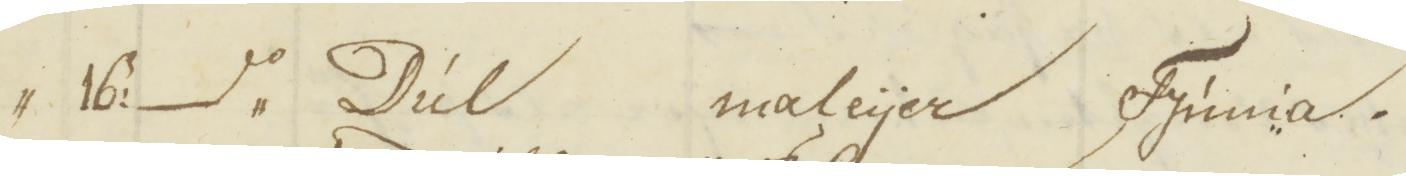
„ 16:en _„o Dul maleijer Tjunia
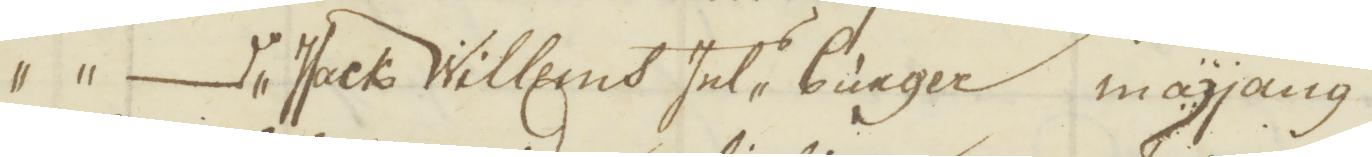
„ „ _„o Jsack Willems Jul„s burger maijang
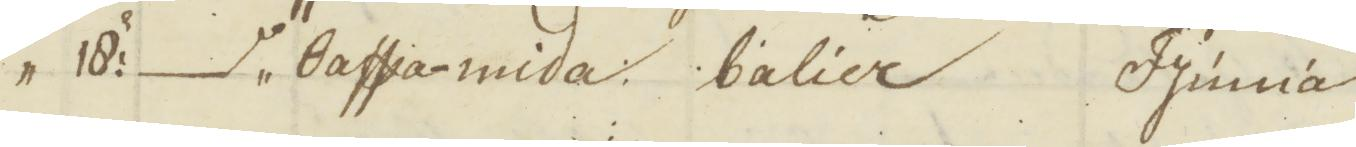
„ 18:en _„o bappa-mida: balier Tjunia
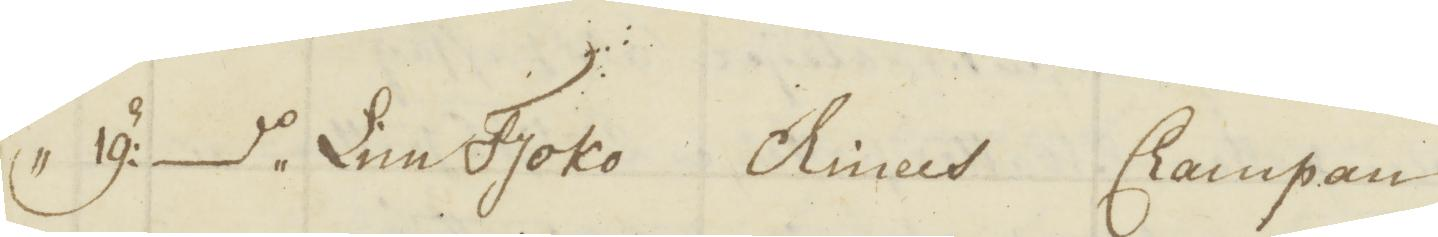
„ 19:en _„o Lim Tjoko Chinees Champan
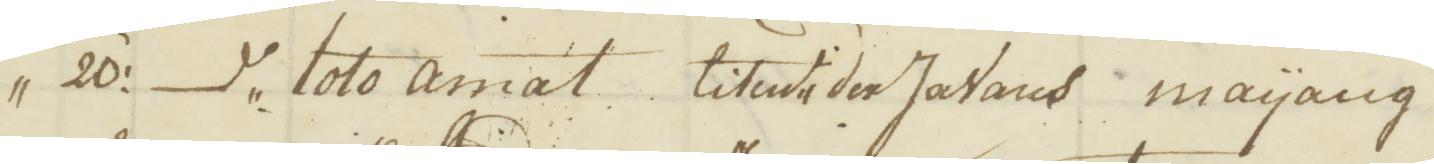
„ 20:en _„o toto amat liteu„t der Javans maijang
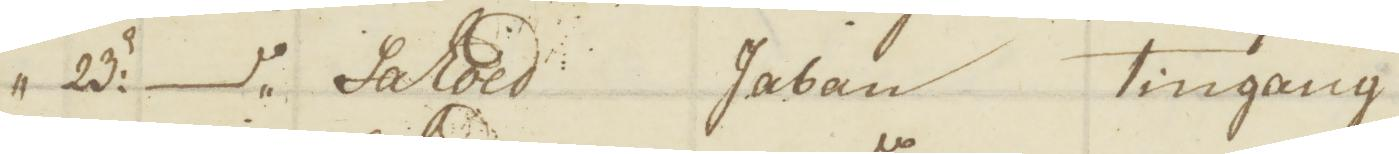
„ 23:en _„o Sahoed Javan tingang
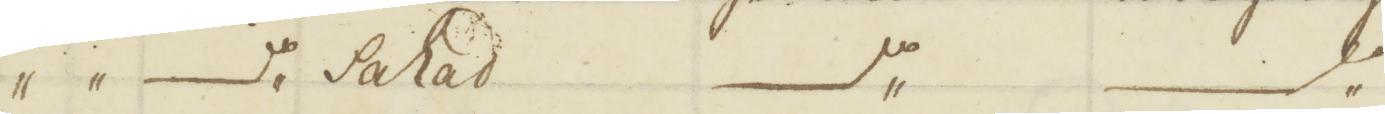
„ „ _„o Sahad _„o _„o
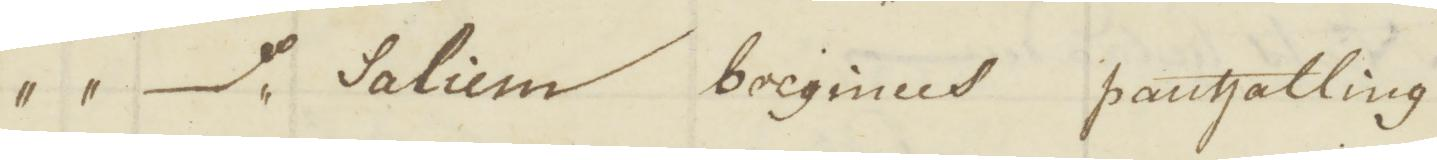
„ „ _„o Saliem boeginees pantjalling
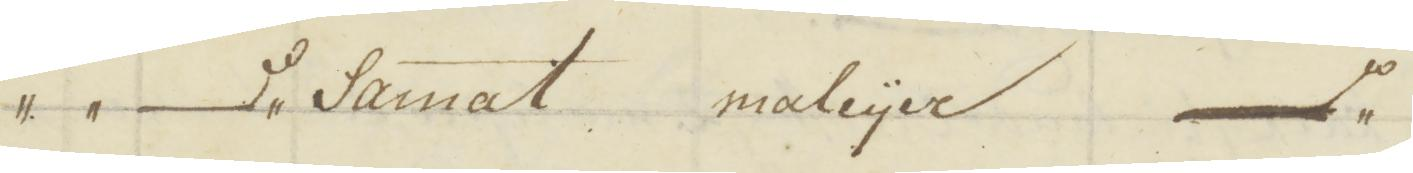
„ „ _„o Samat maleijer _„o
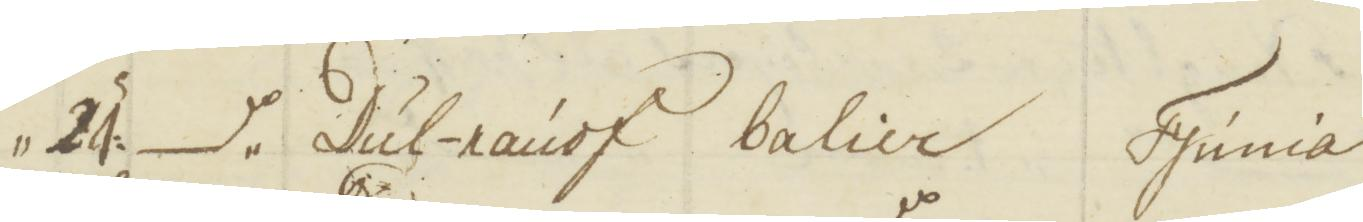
„ 24:en _„o Dul-rauof balier Tjunia
